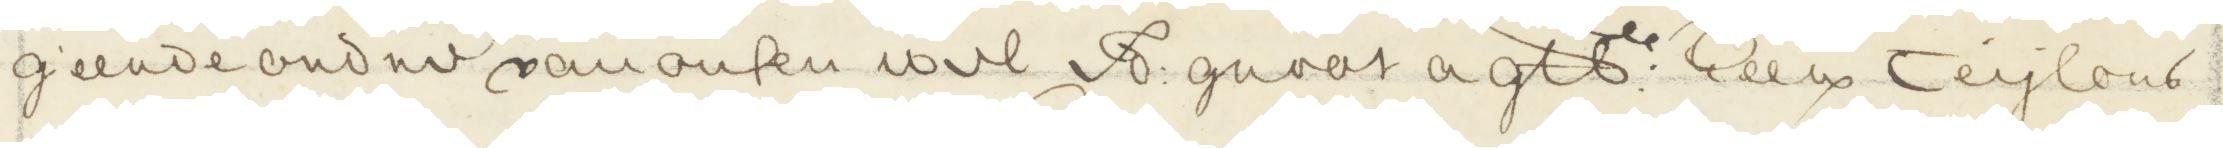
g'eerde ordre van onsen wel Ed: groot agtb: heer Ceijlons
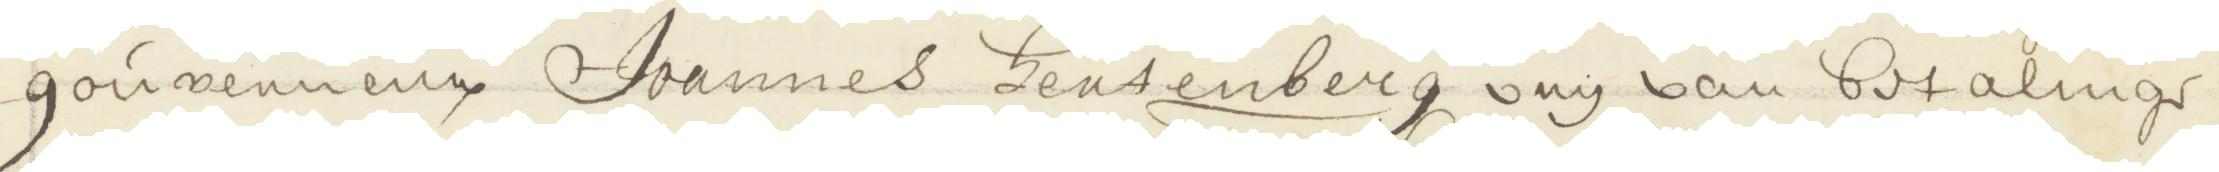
gouverneur Ioannes Hertenberg vrij van betalinge
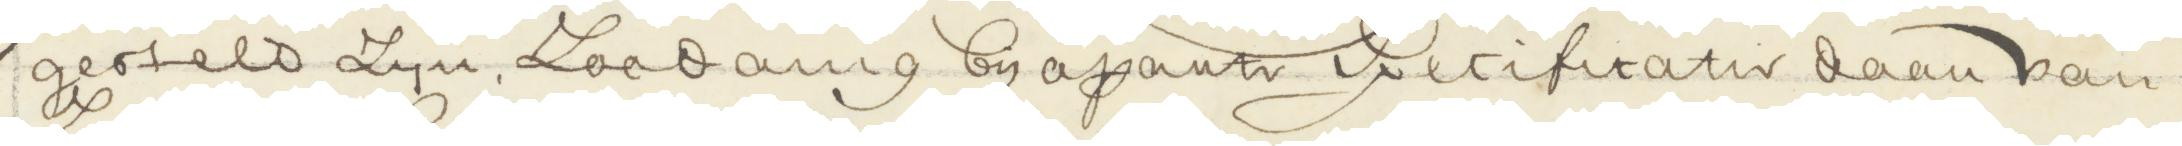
gesteld zijn, zoodanig bij aparte specificatie daar van
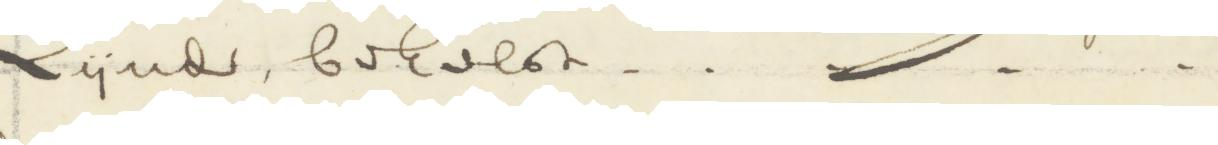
zijnde, behelst - . - - -
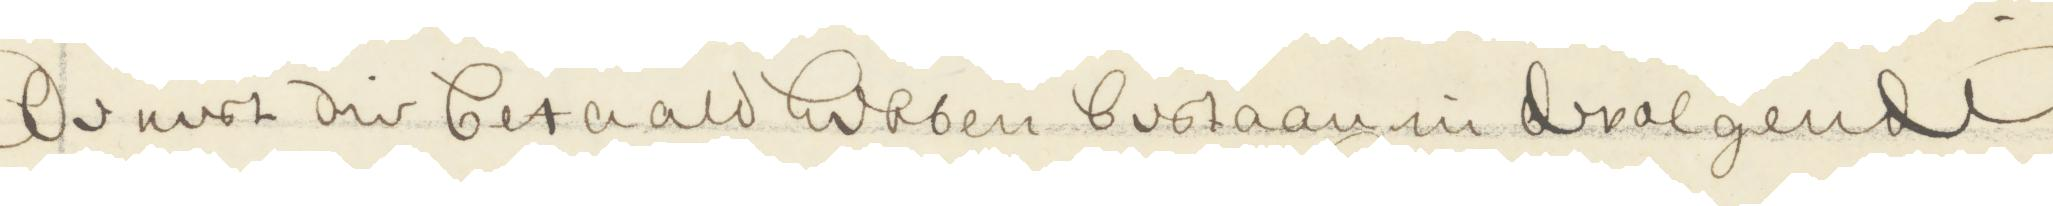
De rest die betaald hebben bestaan in de volgende
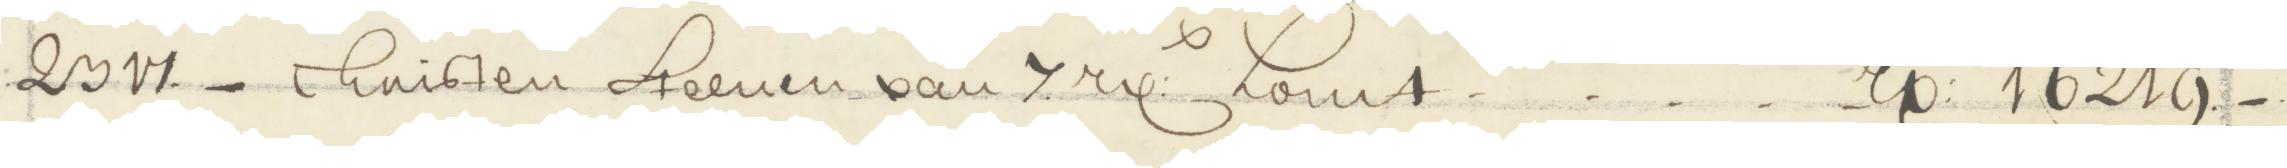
2317 .- christen steenen van 7. rx:s komt - - - - -rx:s 16219.—.
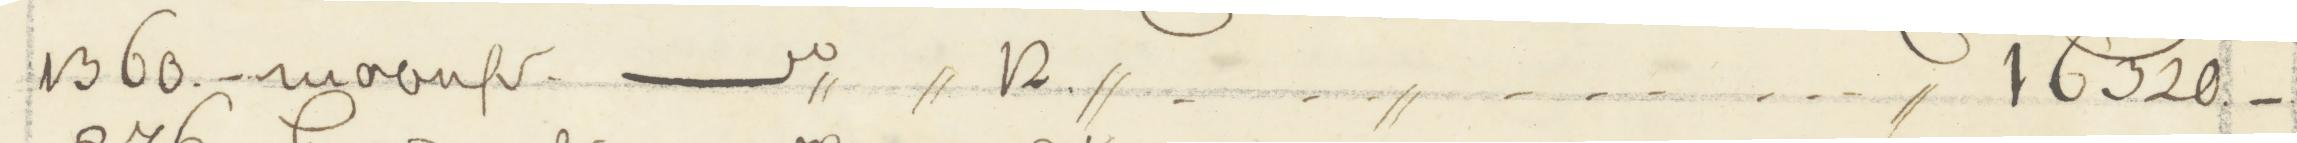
1360.-. moorse. _„o „ 12. „- - .„- - - - - -„ 16320.—
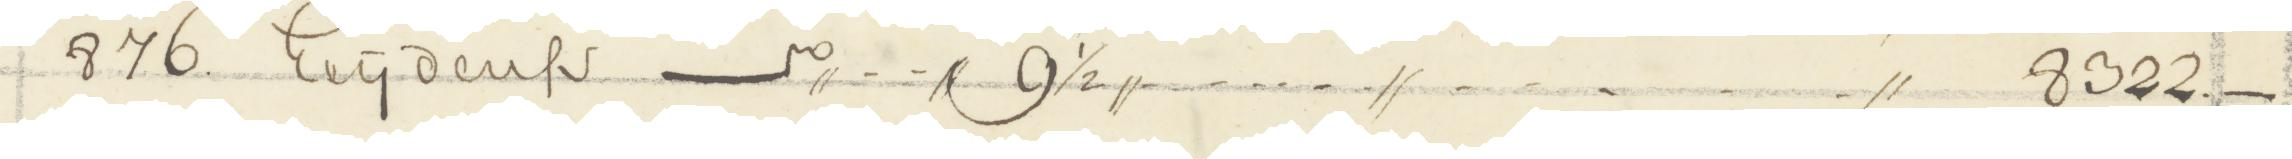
876. heijdense _„o - - „ 9½„ - - - . - .„ - - - - -„ 8322.—
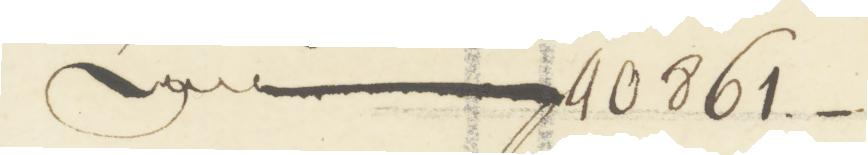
van ƒ 40861.-.
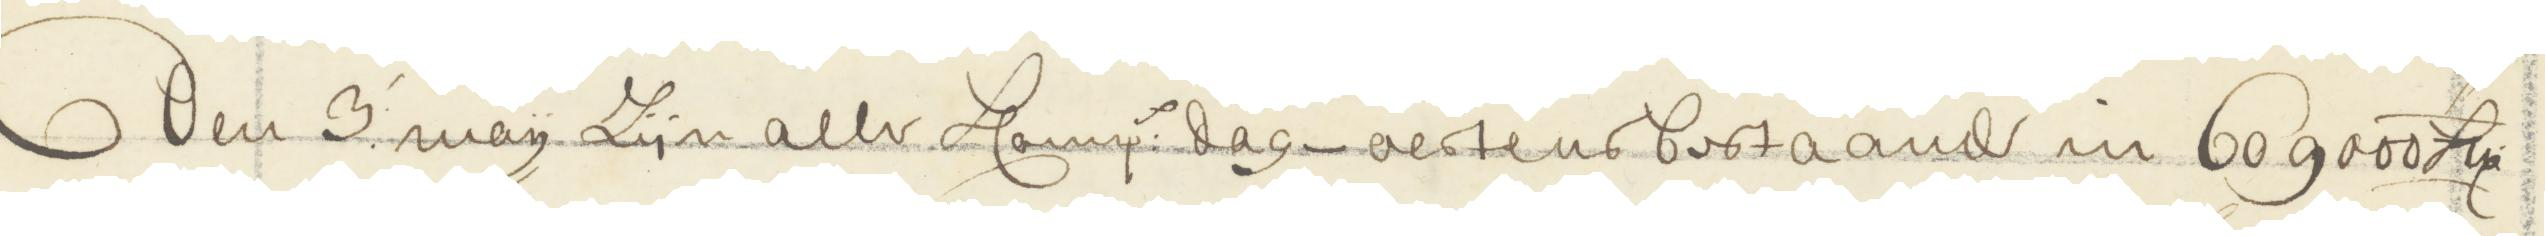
den 3:' maij zijn alle sComp:s dag-oesters bestaande in 609000 stx:
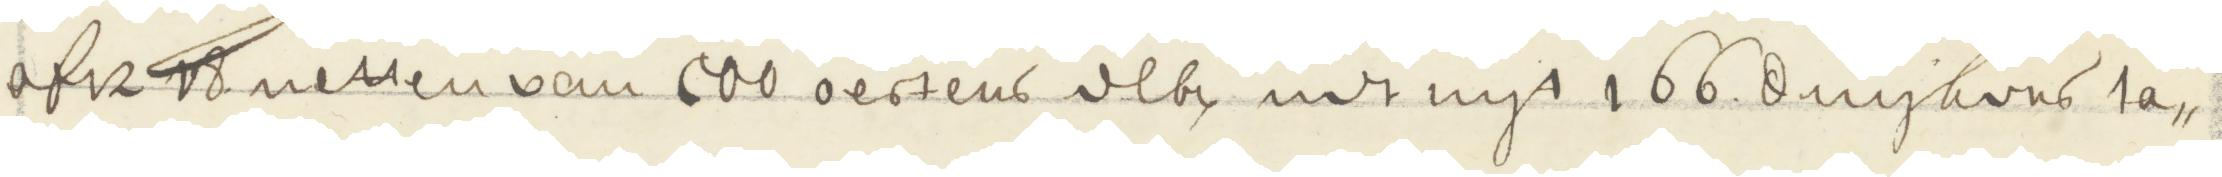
of 1218. netten van 500 oesters elk net uyt 166. duijkers ta„
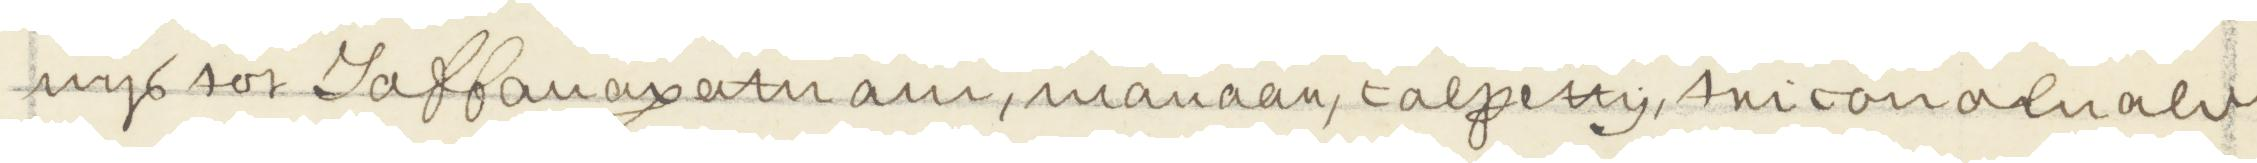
nijs tot Iaffanapatnam, manaar, calpettij, triconalnale
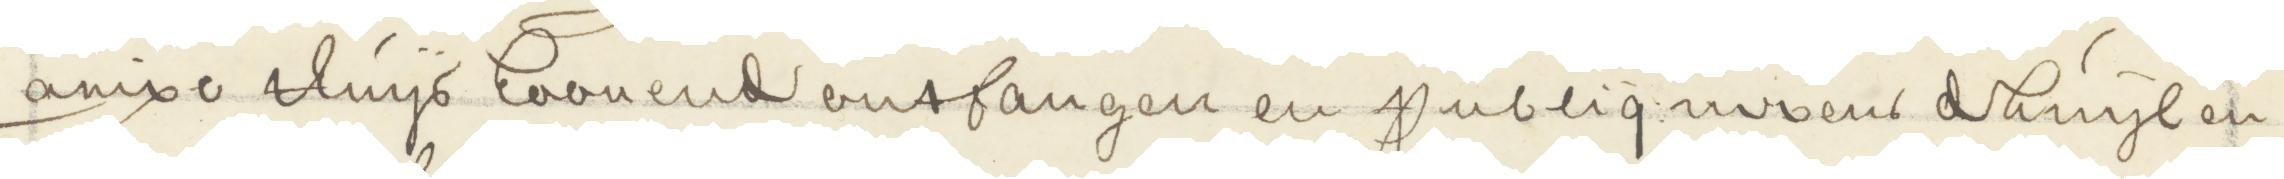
aripo thuijs hoorende ontfangen en publiq: nevens de kuijl en
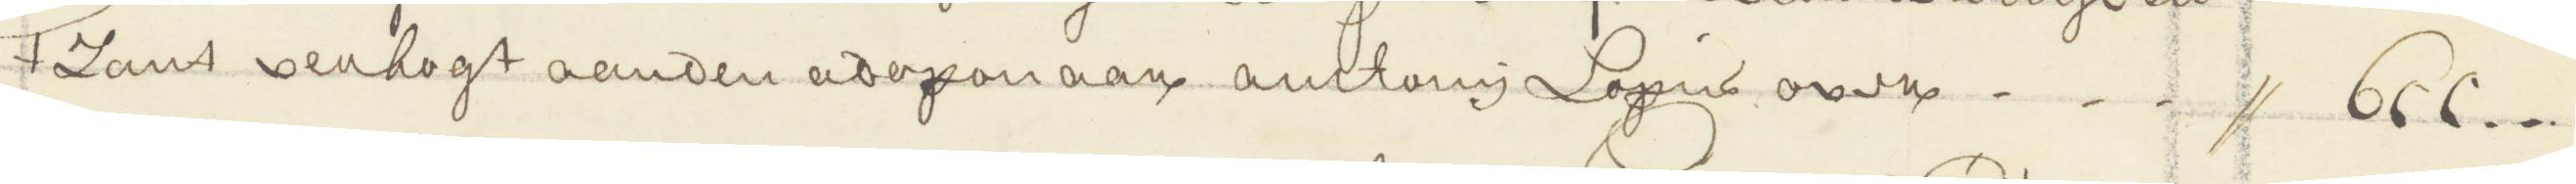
't zant verkogt aanden adoponaar anthonij Lopus over - - - „ 655.-.
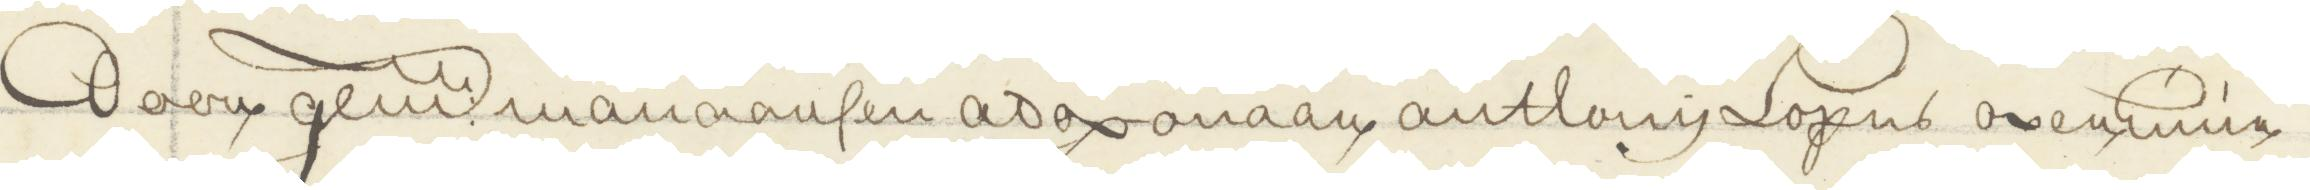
door gem: manaarsen adoponaar anthonij Lopus overhuur
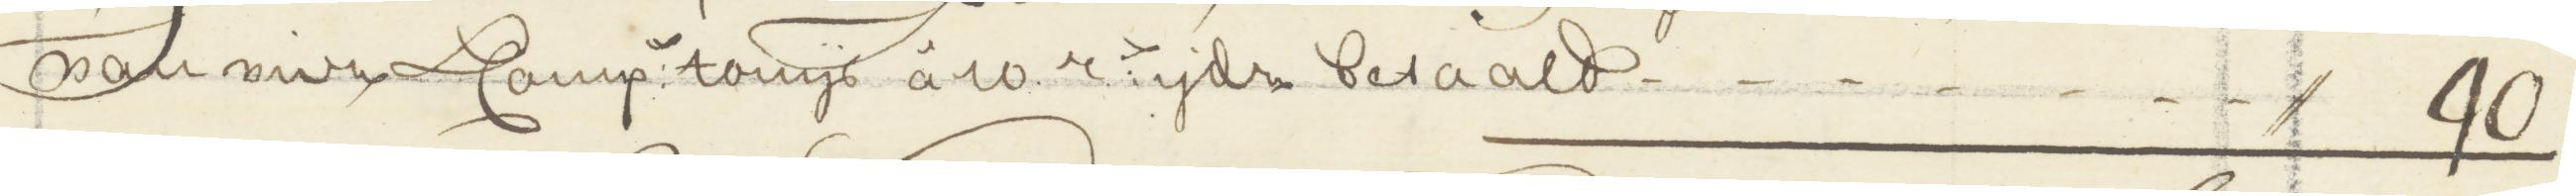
van vier sComp:s tonijs â 10. r:s ijder betaald - - - - - - -„ 40
